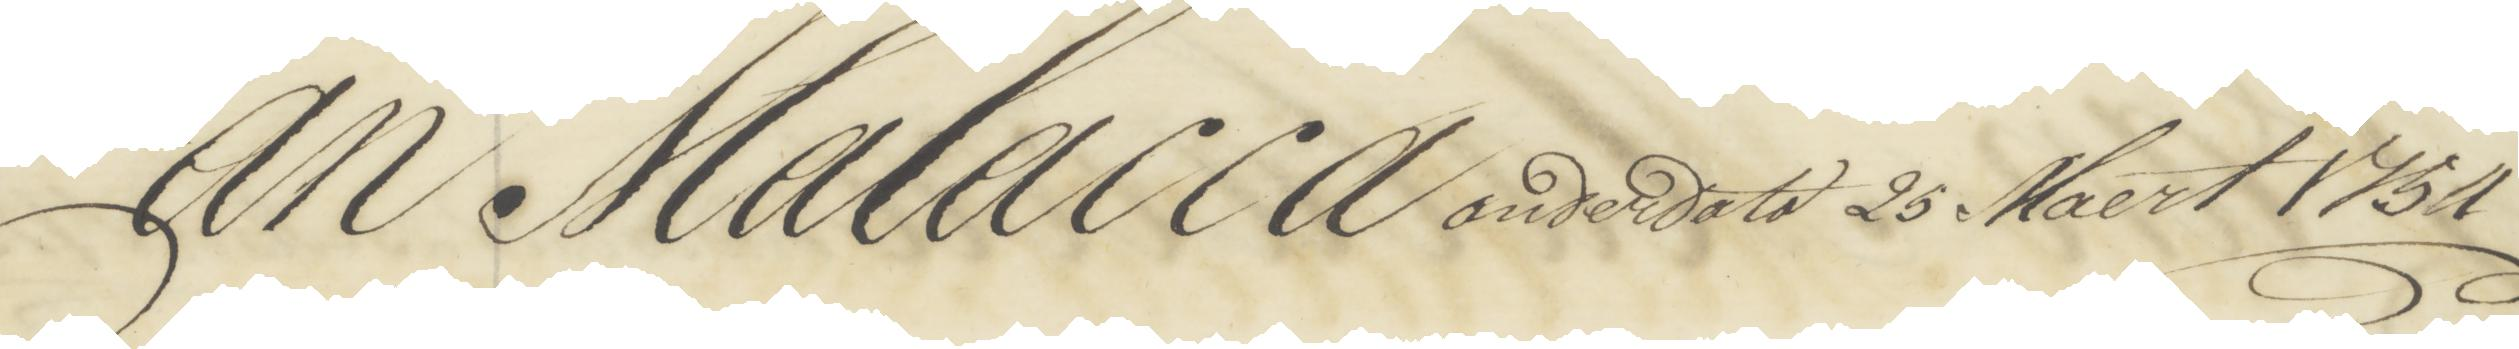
Van Malacca onder dato 25 Maert 1754
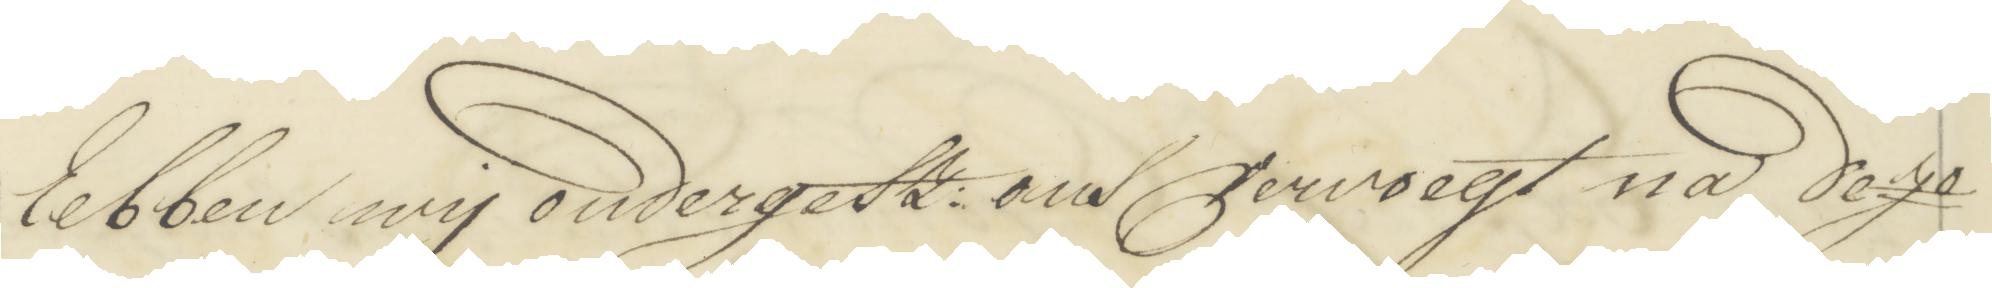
hebben wij ondergesz: ons vervoegt na de Jo
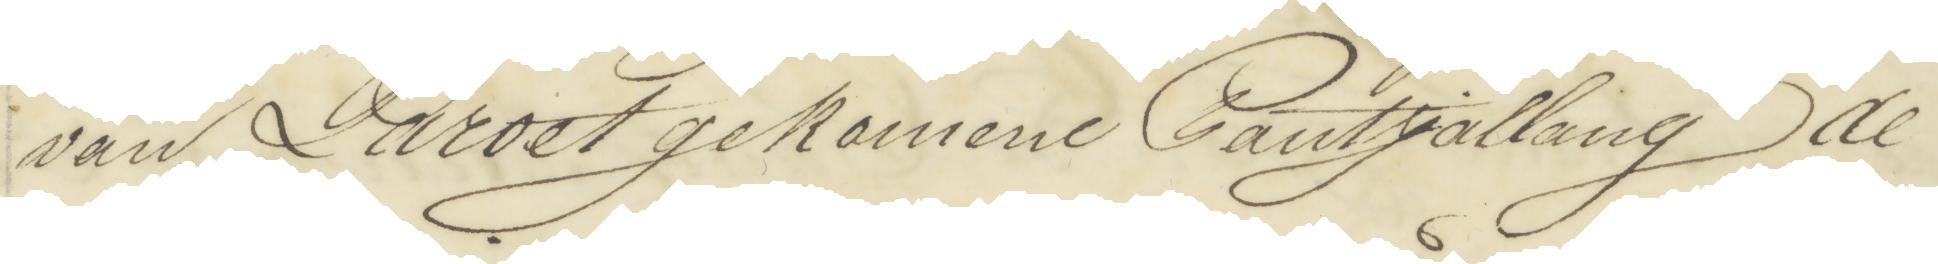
van Laroet gekomene Pantjallang de
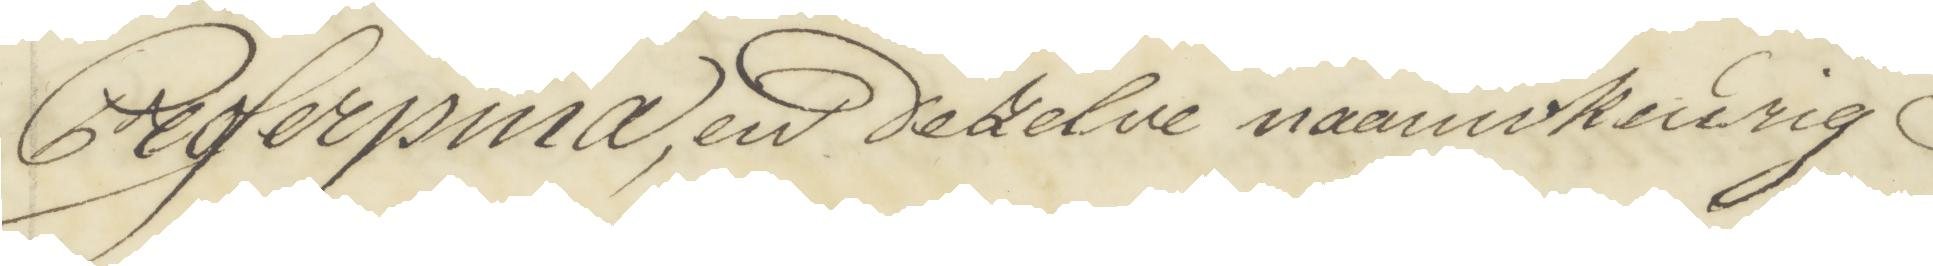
Proserpina, en dezelve naauwkeurig
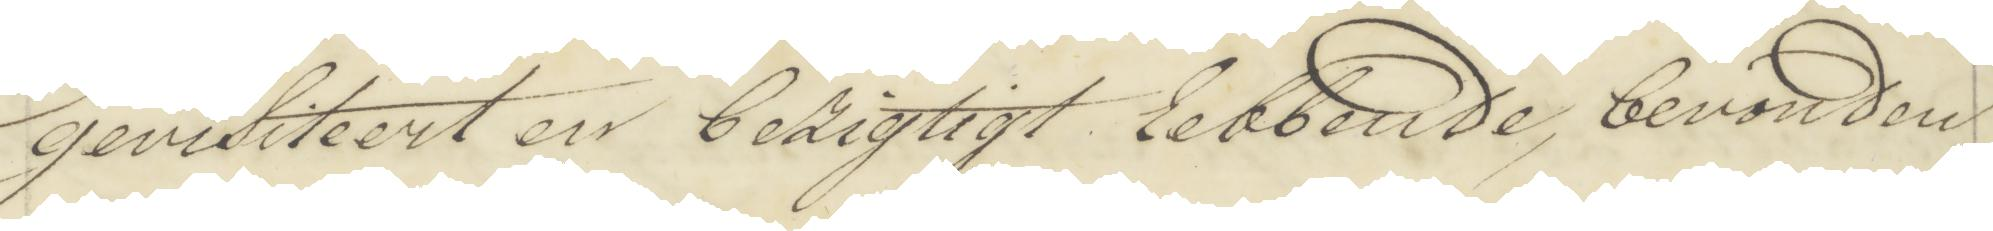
gevisiteert en bezigtigt hebbende, bevonden
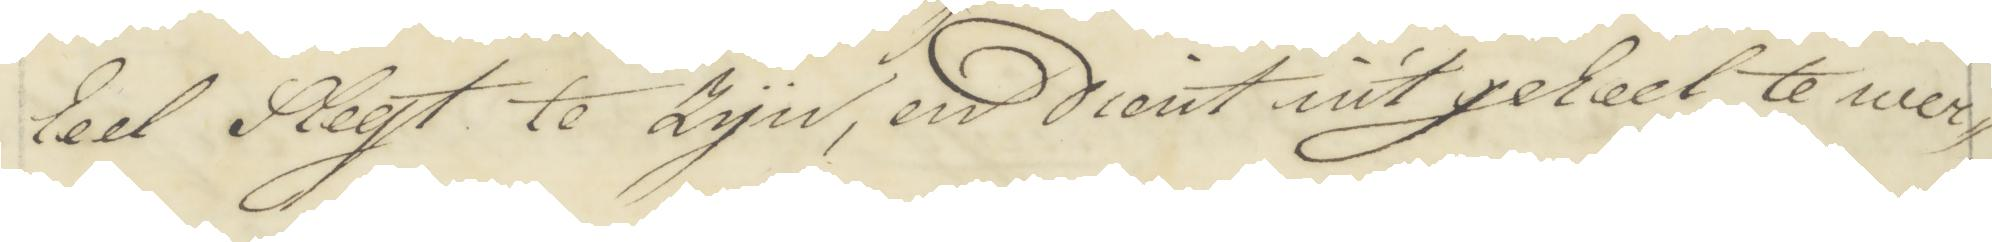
heel slegt te zijn, en dient in 't geheel te wer„
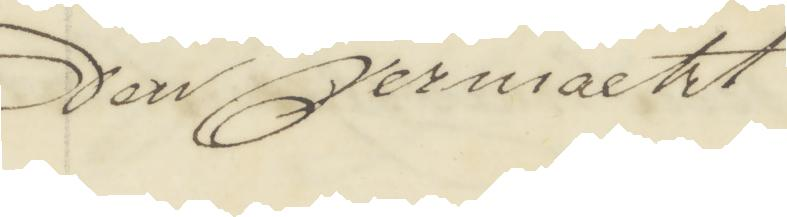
den vermaekt
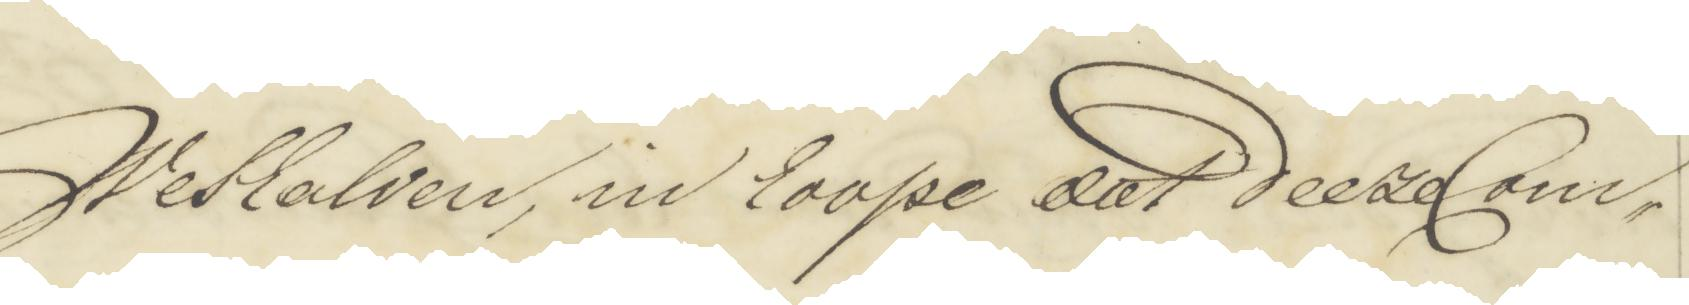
Weshalven, in hoope dat deeze Com„
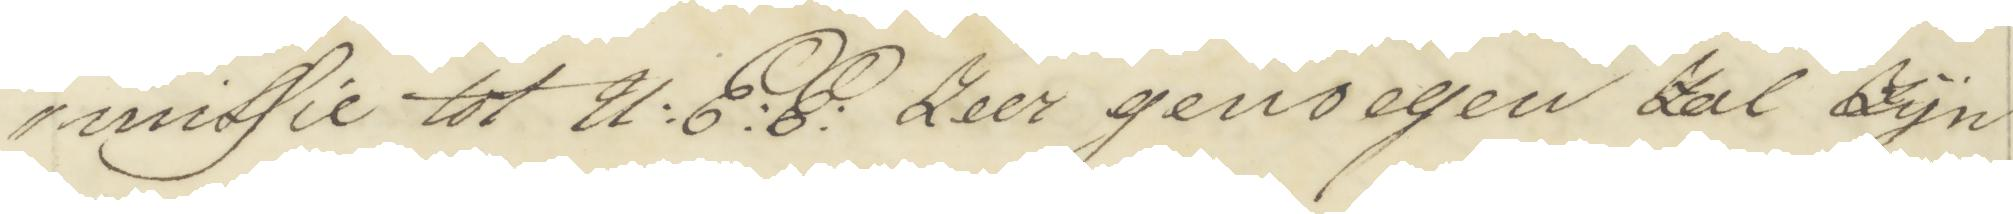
„missie tot U: E: E: zeer genoegen zal zijn
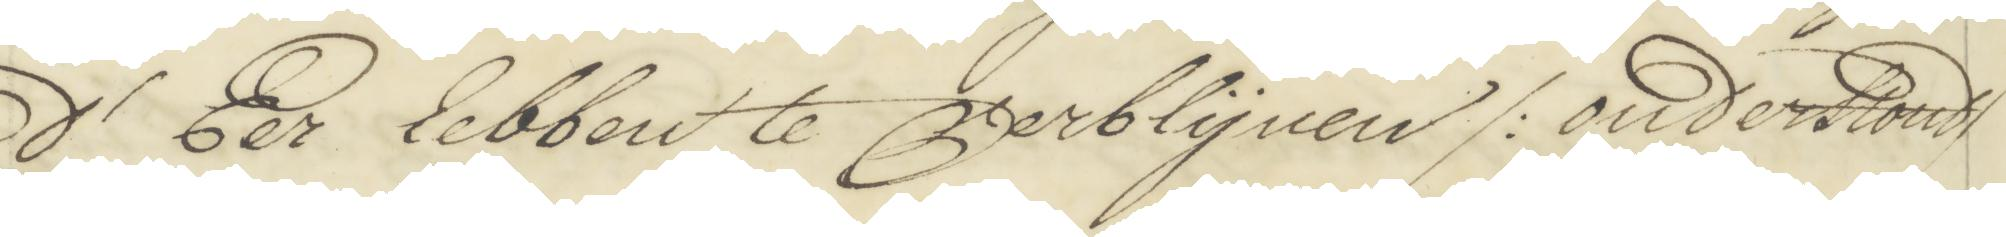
d’Eer hebben te verblijven /: onderstond /
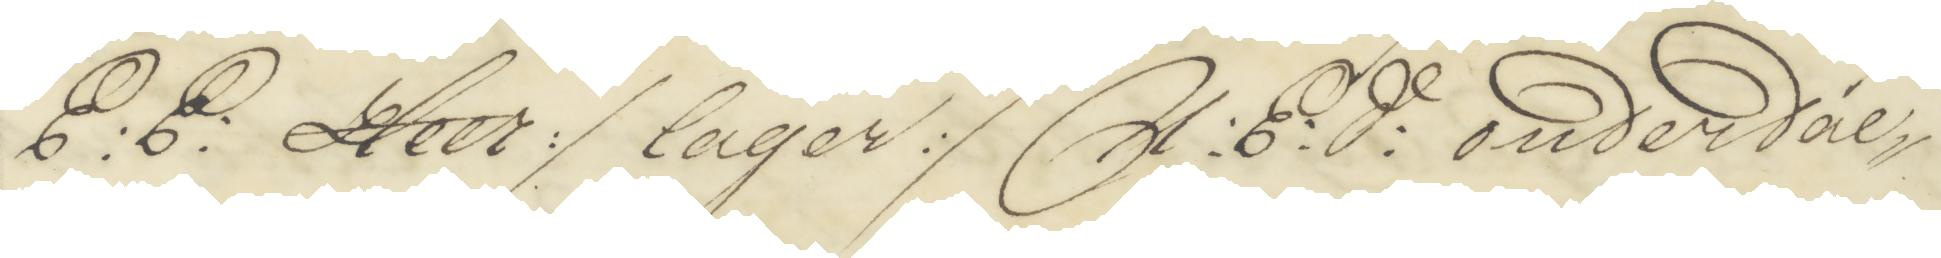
E: E: Heer :/ lager :/ U: E: d:e onder dae„
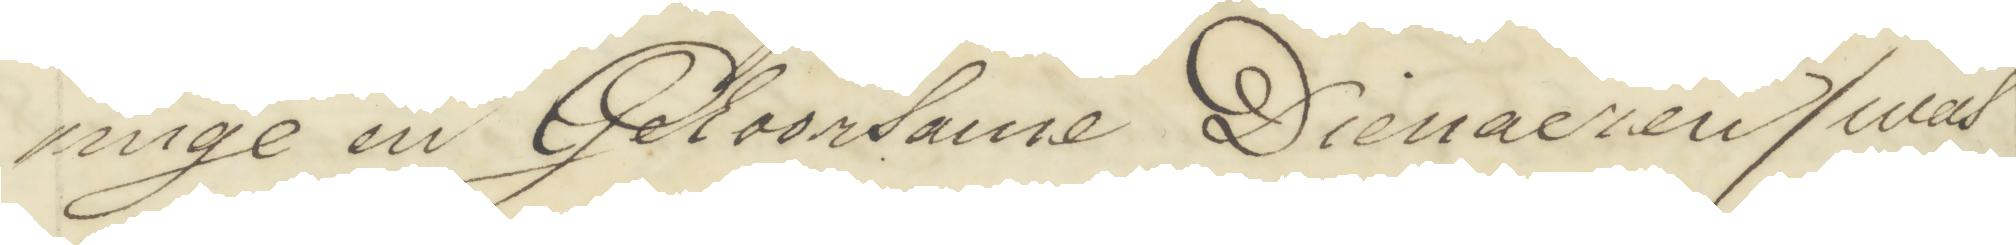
„nige en Gehoorsame Dienaeren / was
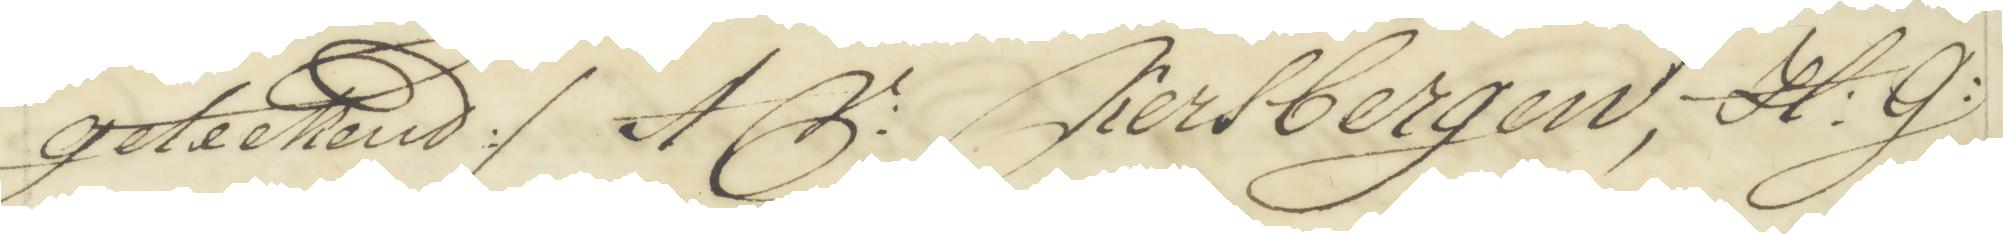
geteekend: / A V: Kersbergen, H: G:
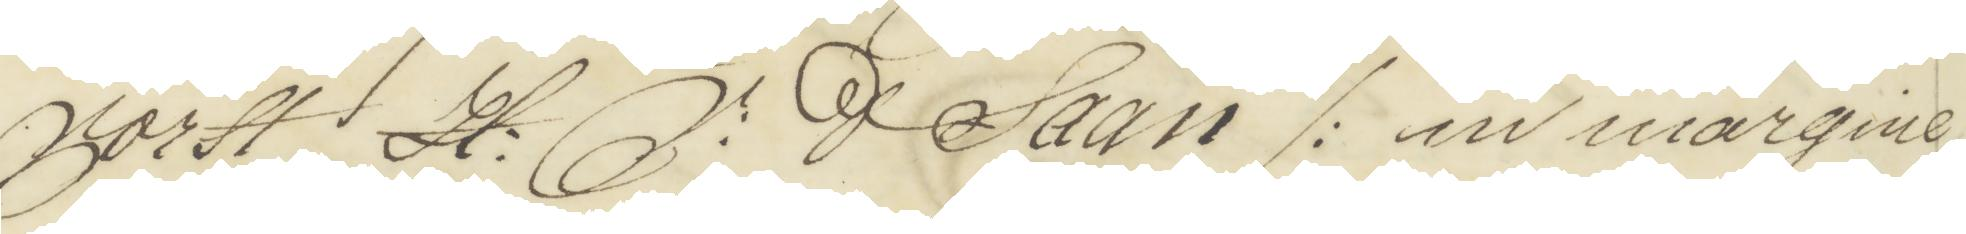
vorst H: V: d Saan /: in margine /
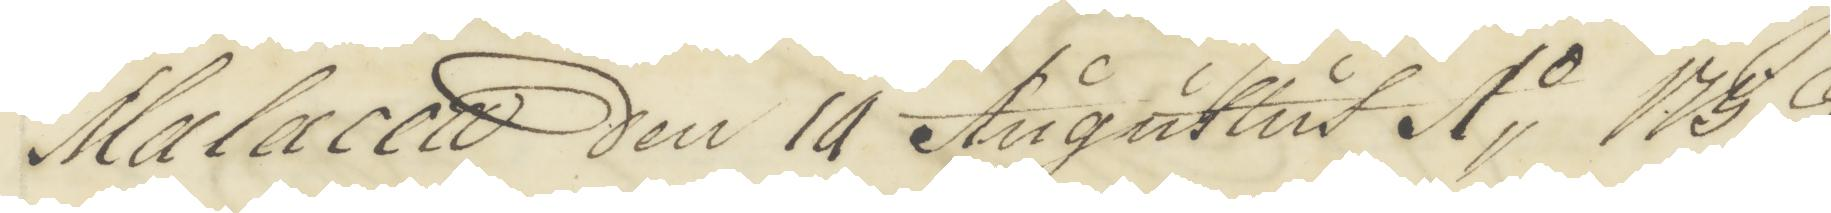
Malacca den 14 Augustus A„o 1753
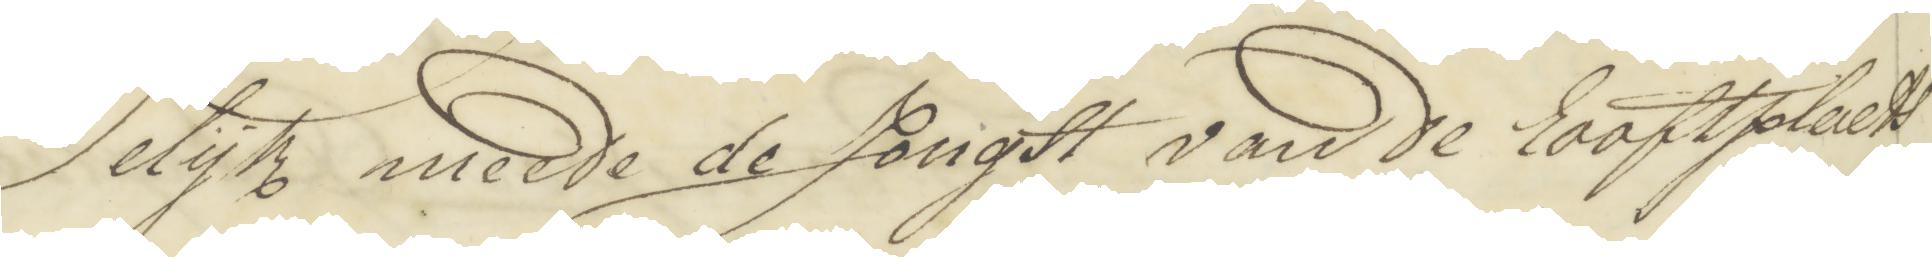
Gelijk meede de Jongst van de hooftplaets
